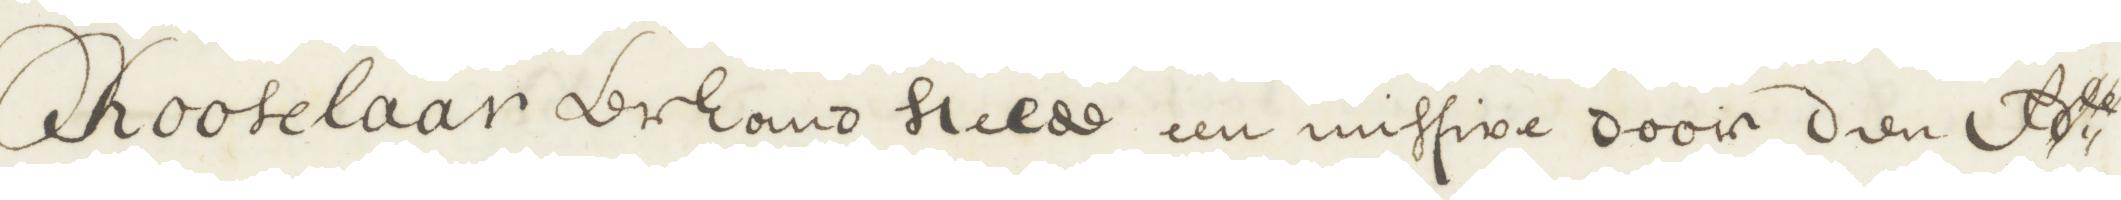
Kooselaar ter hand stelde een missive door den Ed„le
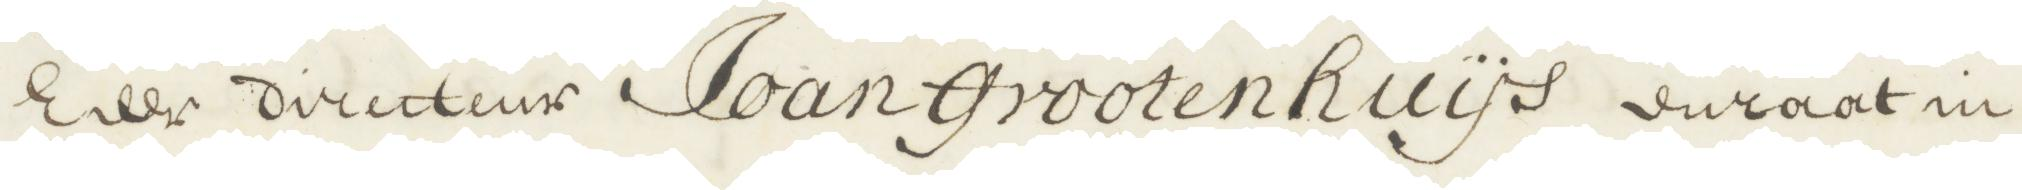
heer directeur Joan Grootenhuijs en raat in
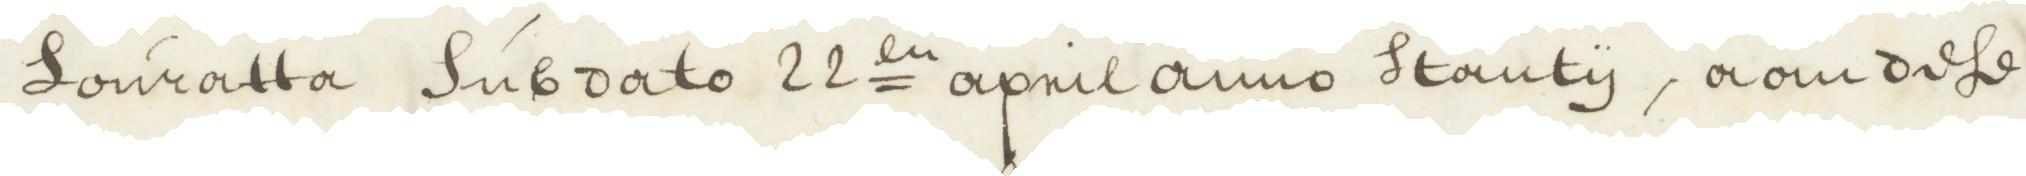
Souratta sub dato 22=en april anno stantij, aan dese
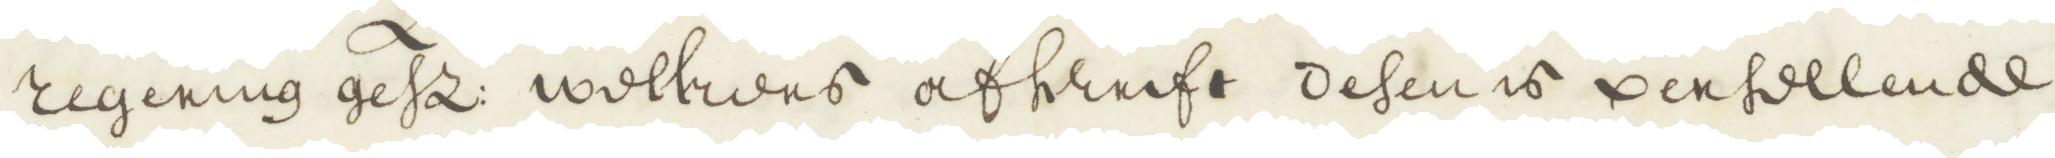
regering gesz: welkers afschrift desen is versellende
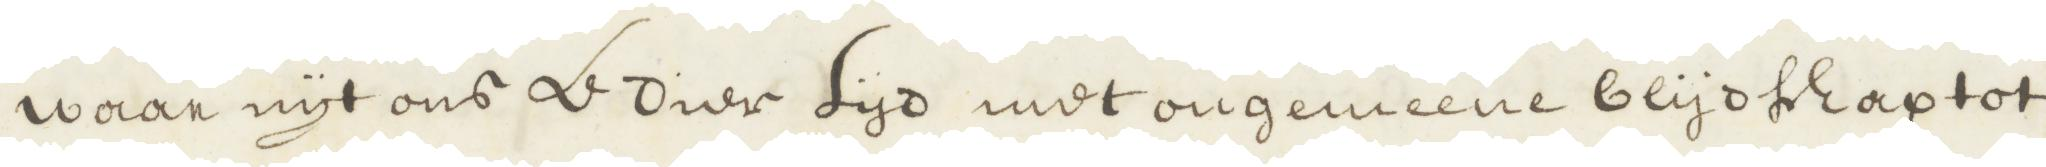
waar uijt ons te dier tijd met ongemeene blijdschap tot
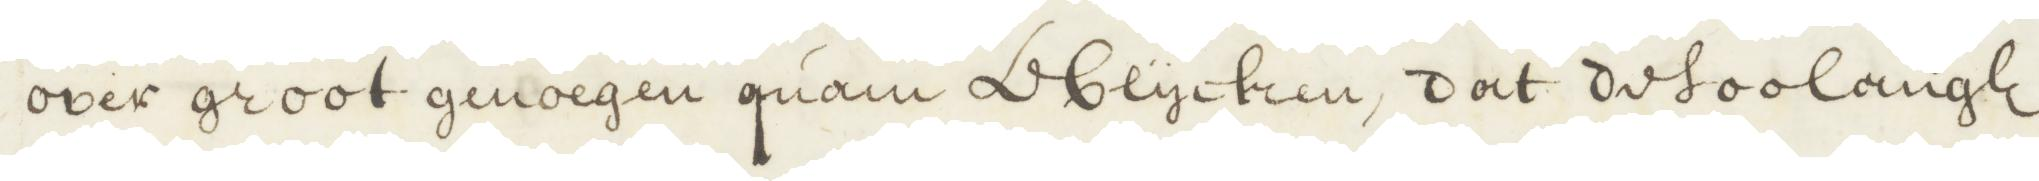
over groot genoegen quam te blijcken, dat desoolangh
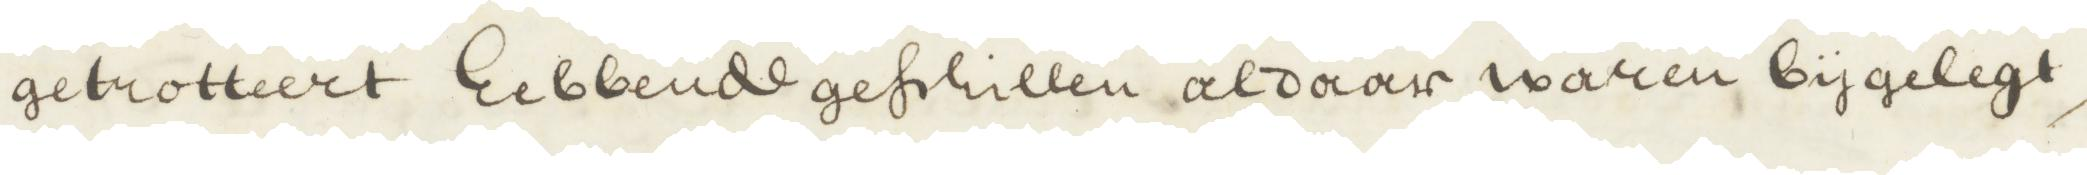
getrotteert hebbende geschillen aldaar waren bij gelegt,
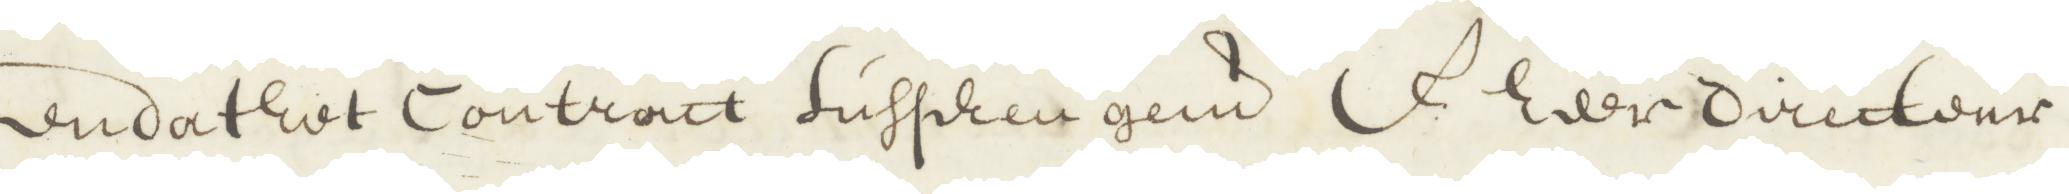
en dat het Contract tusschen gem' E heer directeur
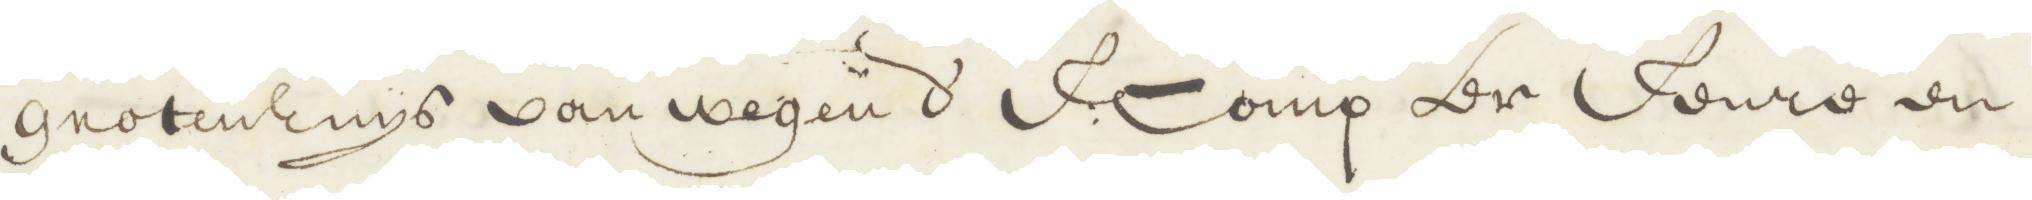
Grotenhuijs van wegen d’ E: Comp ter Eenre en
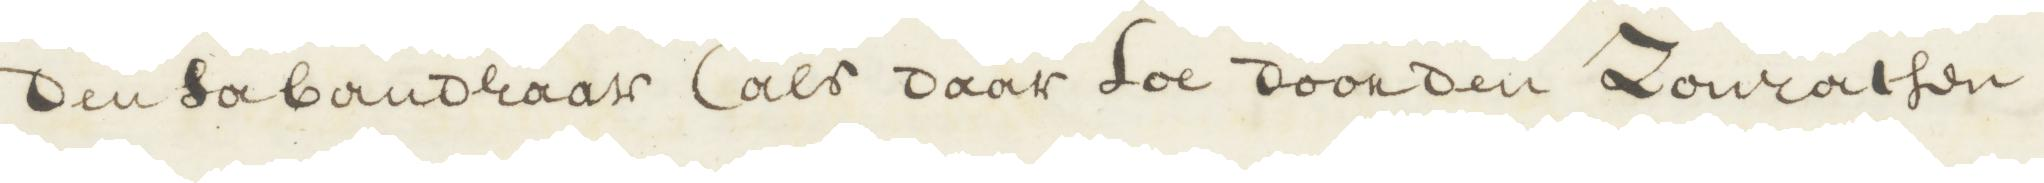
den sabandhaar (als daar toe door den Zouratsen
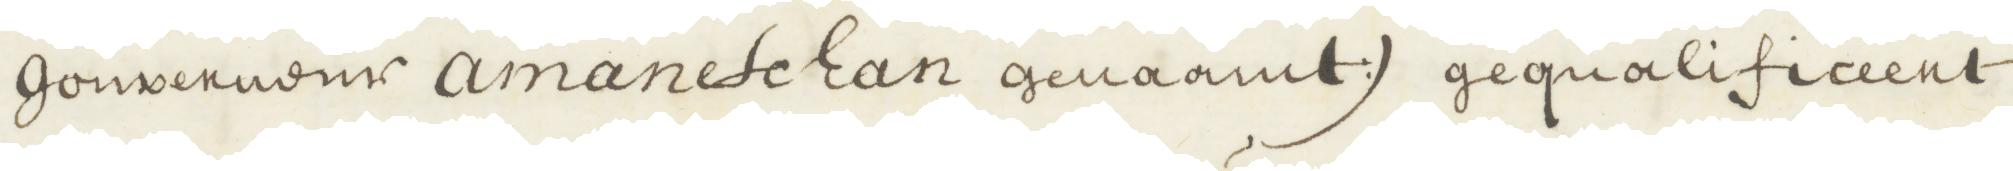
gouverneur Amaneschan genaamt:) gequalificeert
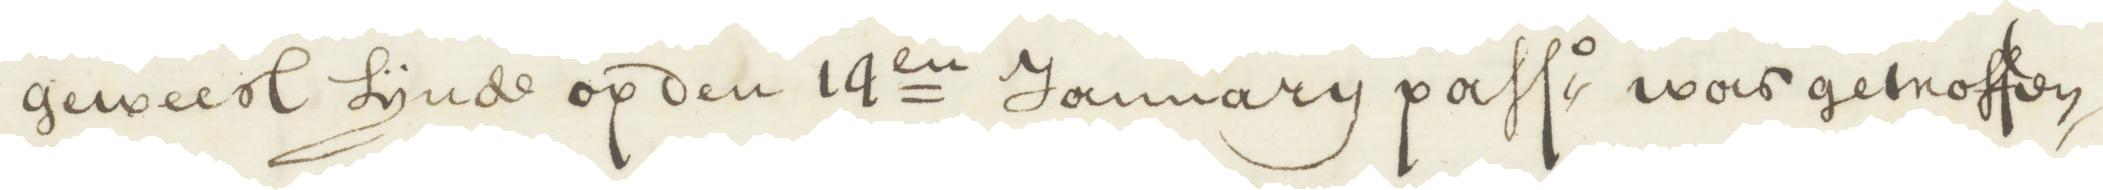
geweest sijnde op den 14=en Ianuarij pass„o was getroffen,
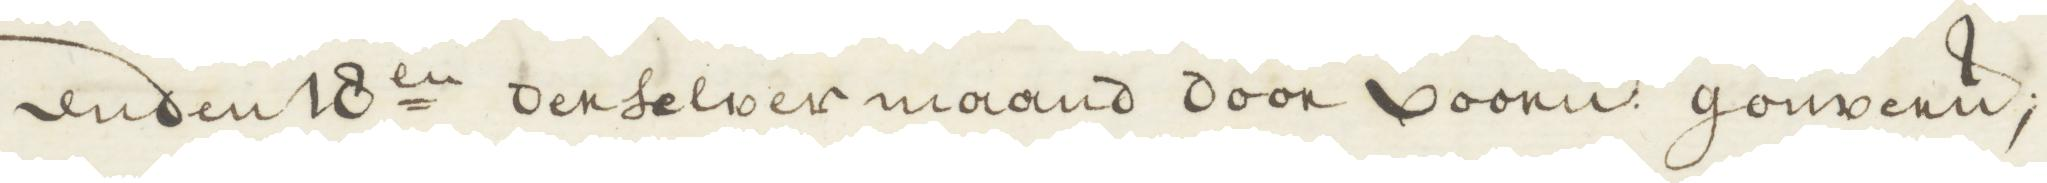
en den 18=en derselver maand door voorn:' gouvern;'
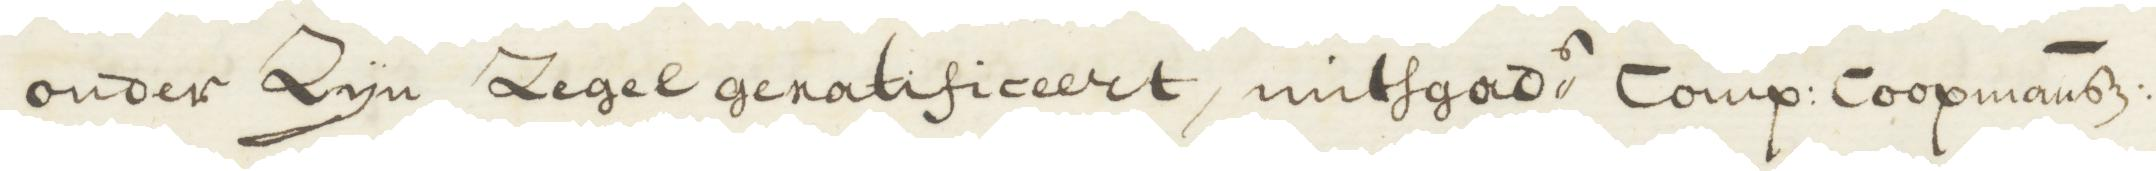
onder zijn zegel geratificeert, mitsgad„s Comp:s coopmans3:
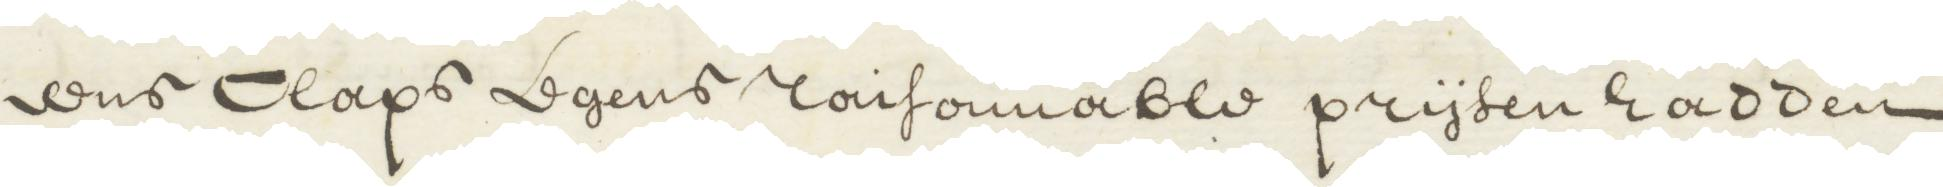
eens Claps tegens raisonnable prijsen hadden
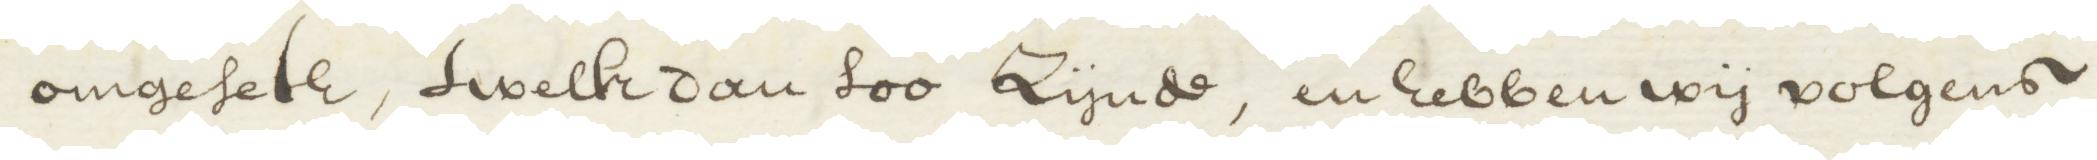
omgeseth, twelk dan soo zijnde, en hebben wij volgens
